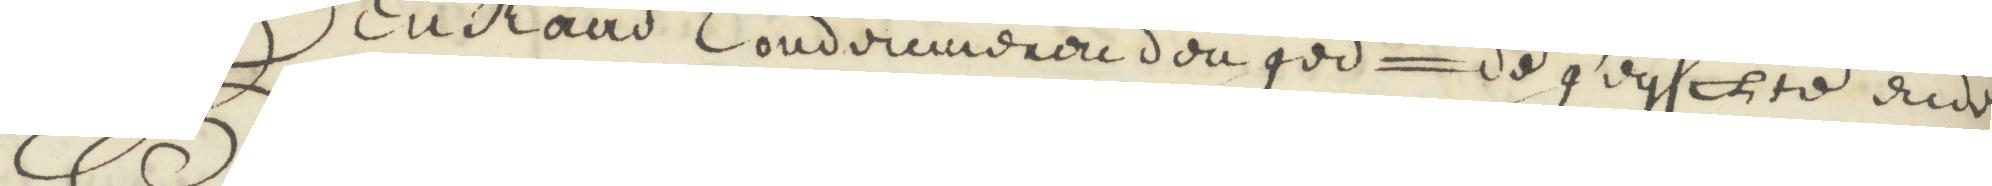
Den Raad Condemneren den ged=e de g'eijschte ende
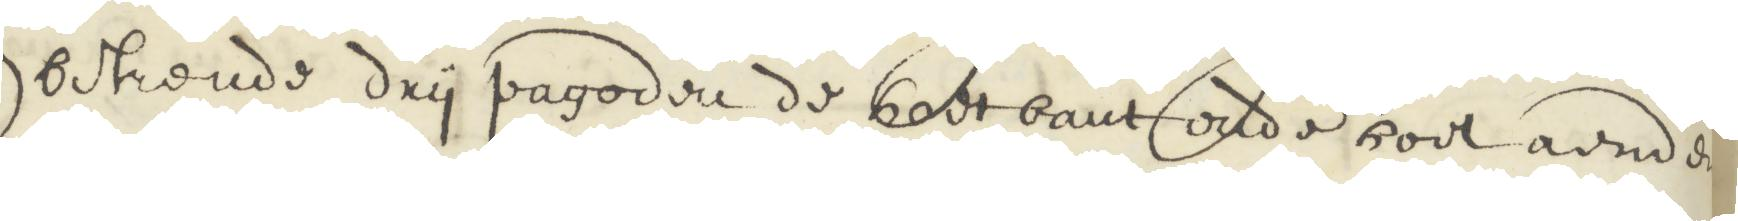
bekende drij pagoden de hoetbant ende hoet aende
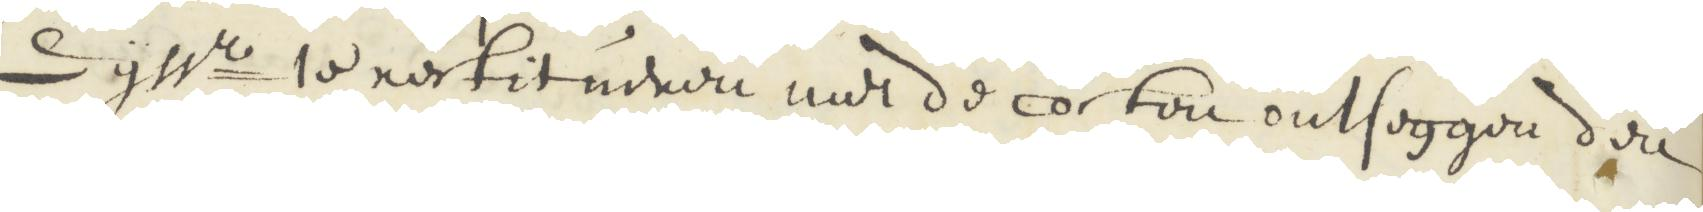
Eijss=r te restitueren met de costen ontseggen den
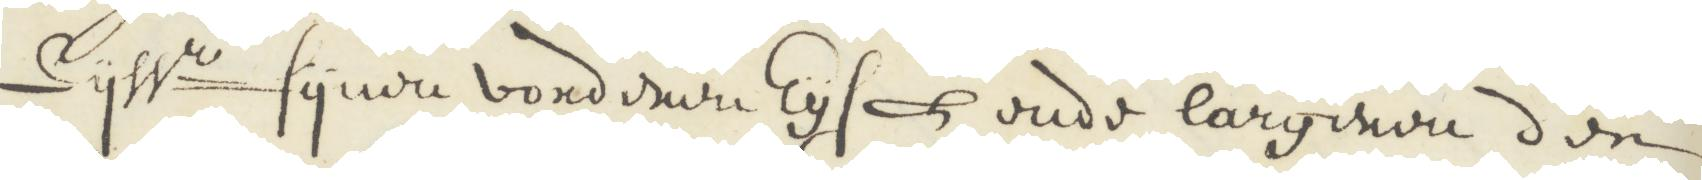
Eijss=r sijnen vorderen Eijsch ende largeren den
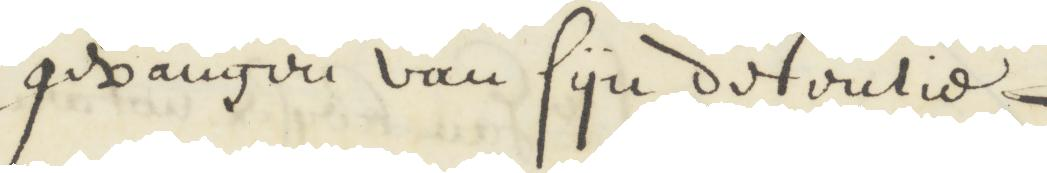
gevangen van sijn detentie
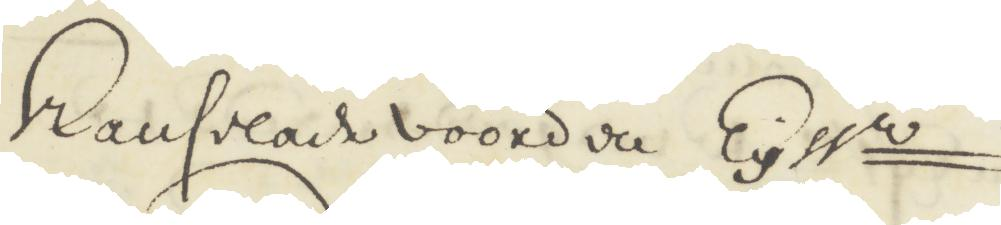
Kanselaer voorden Eijss=r
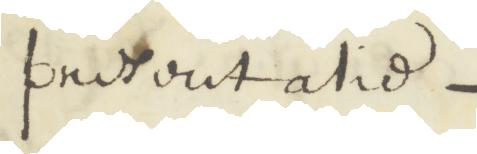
presentatie —
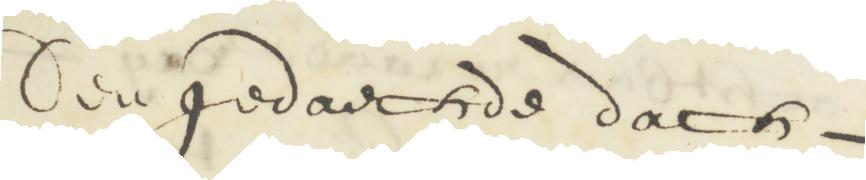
den gedaechde dach —
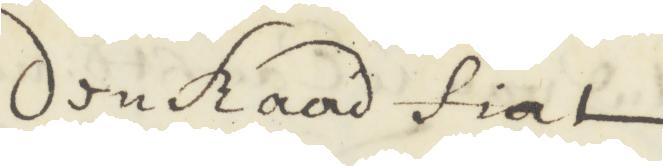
den Raad fiat
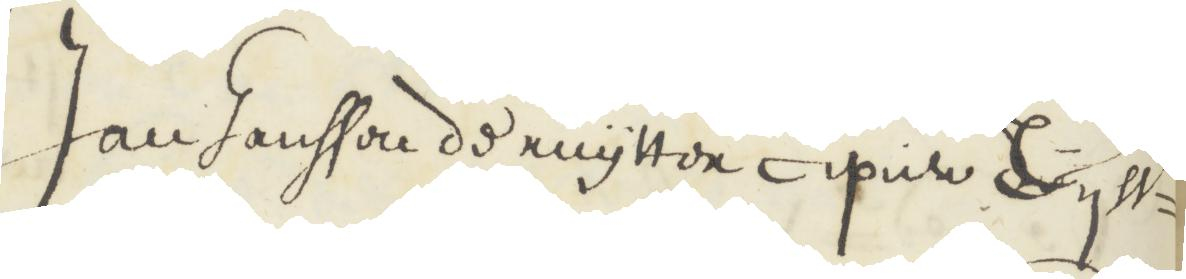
Jan Janssen de ruijtter cipier Eijss=r
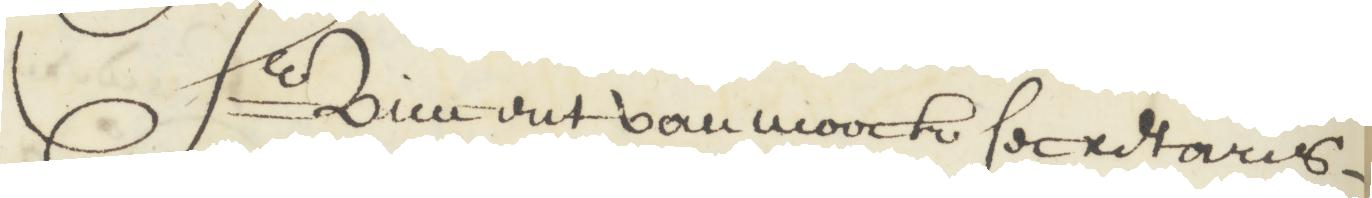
S=r Vincent van moock secretaris —
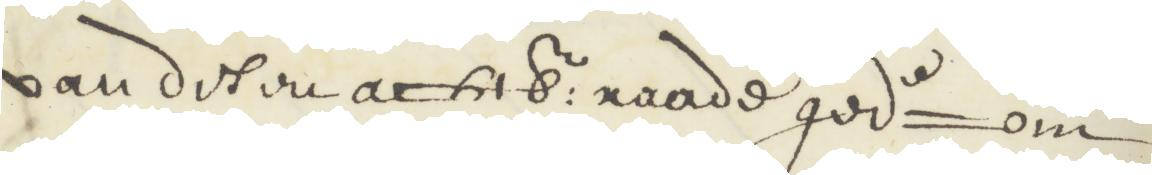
van desen achtb:r raade ged=e om
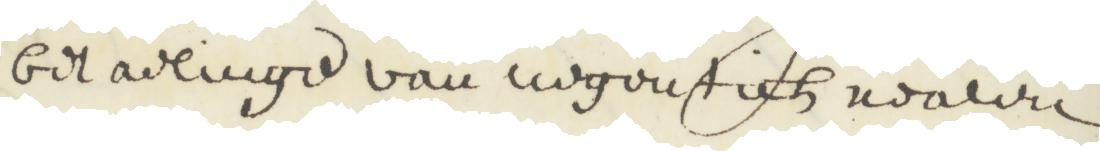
betaelinge van negentich realen
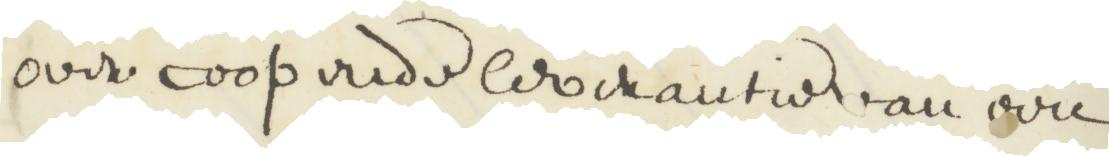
over coop ende leverantie van een
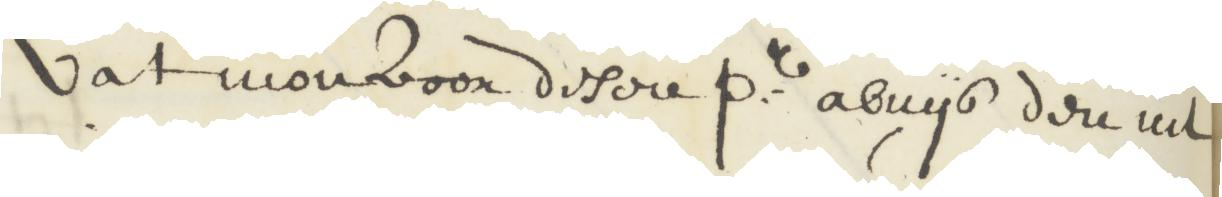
vat monvoor desen p=r abuijs den int
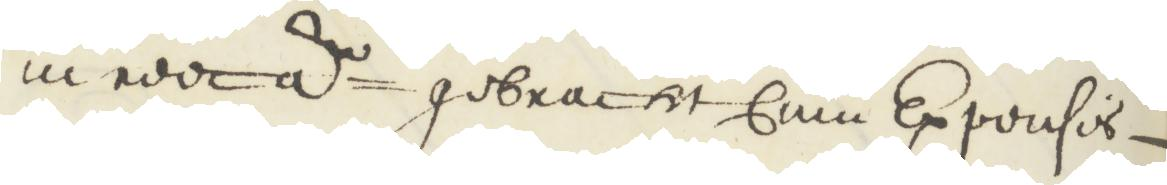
in reecq=n gebracht Cum Expensis —
